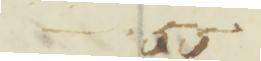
-. 55
